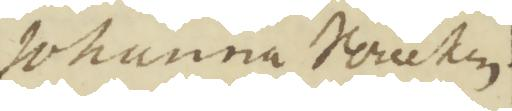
Johanna Vereeken
